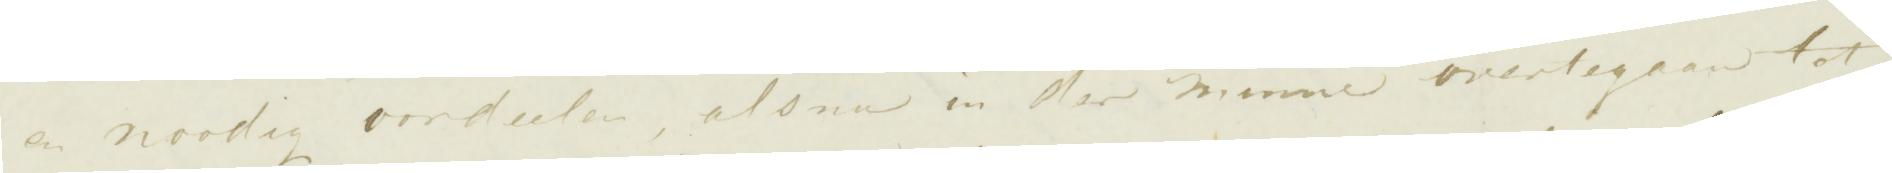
en noodig oordeelen, alsnu in der minne overtegaan tot
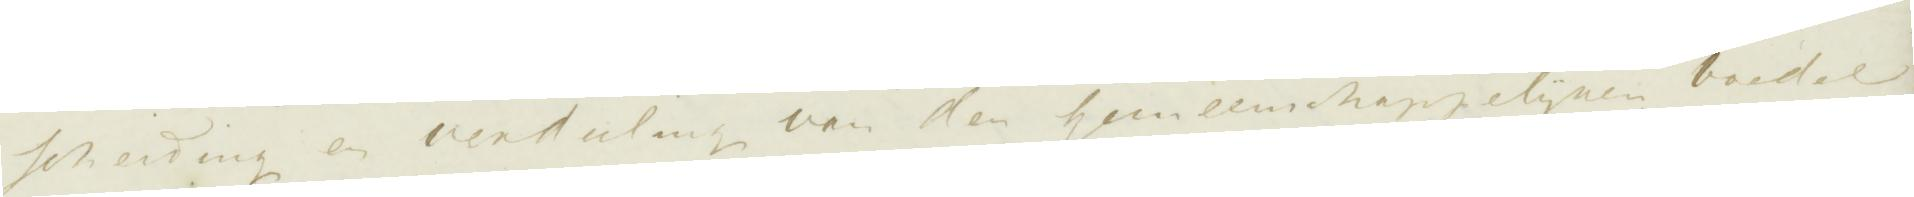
scheiding en verdeeling van den gemeenschappelijken boedel
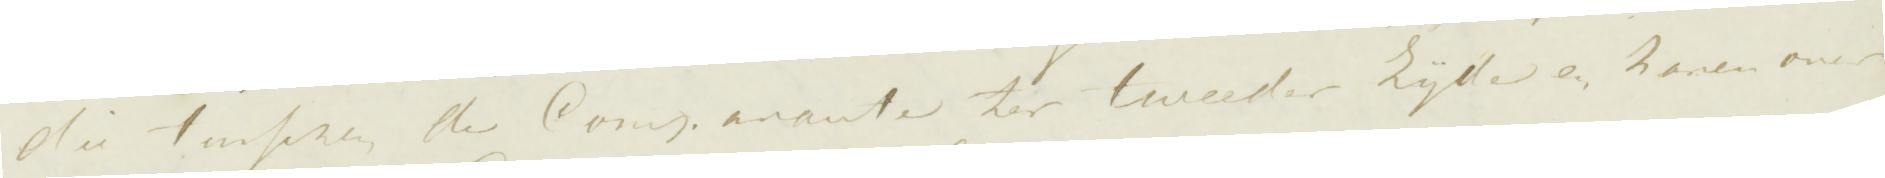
die tusschen des Comparante ter tweeder zijde en haren over
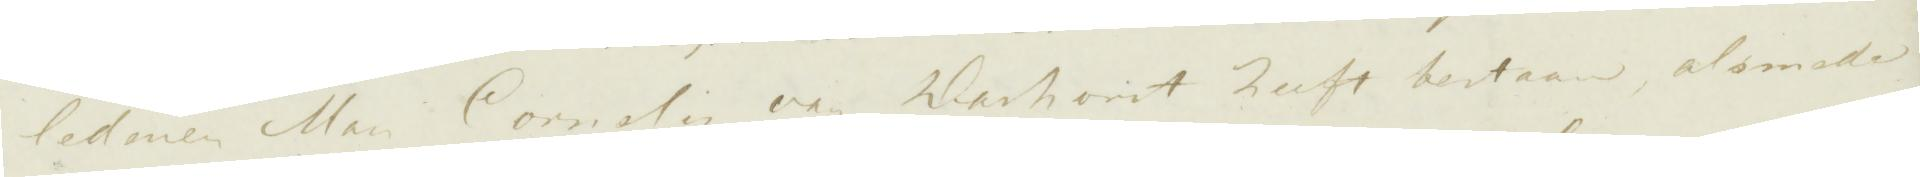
ledenen Man Cornelis van Dashorst heeft bestaan, als mede
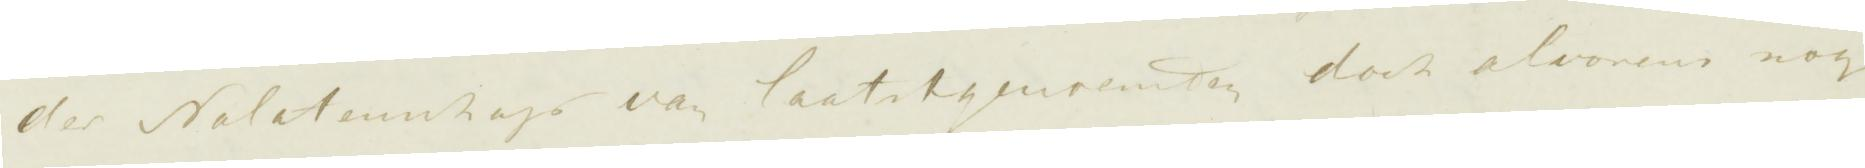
der Nalatenschap van laatstgenoemden doch alvorens nog
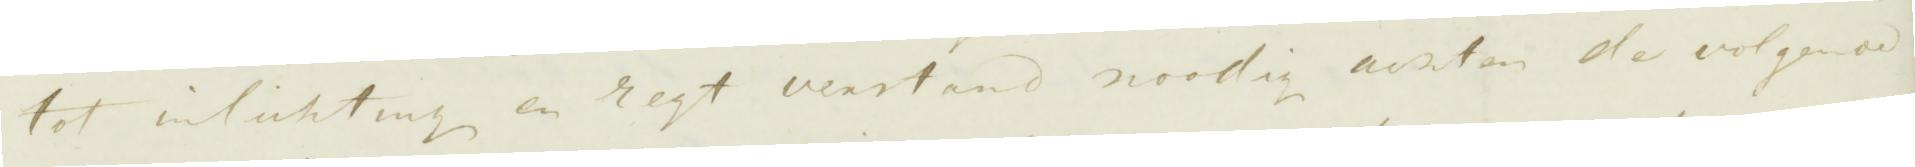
tot inlichting en regt verstand noodig achten de volgende
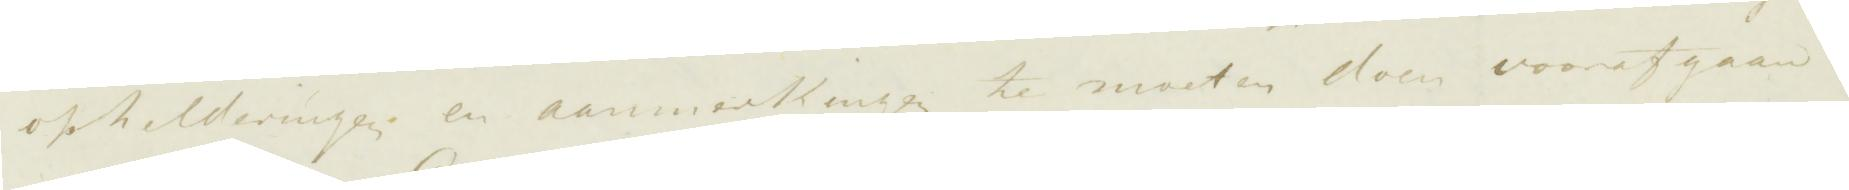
ophelderingen en aanmerkingen te moeten doen voorafgaan
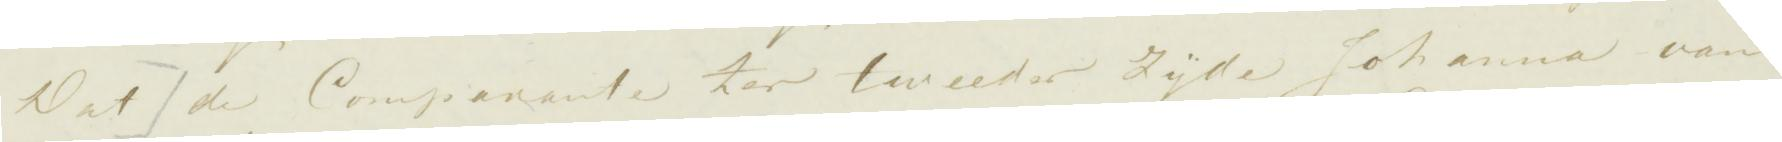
Dat de Comparante ter tweeder zijde Johanna van
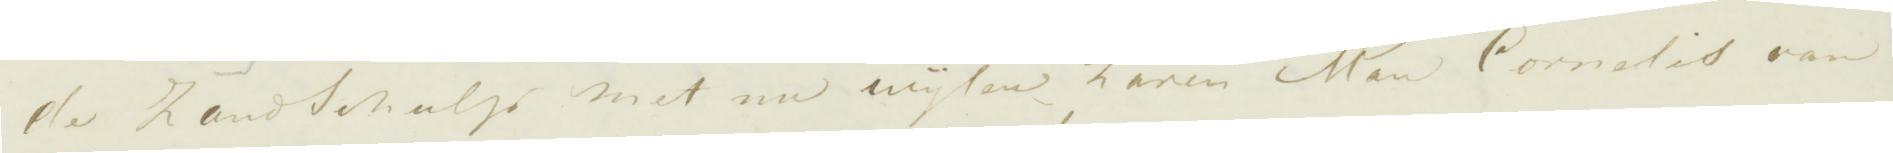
de Zandschulp met nu wijlen haren Man Cornelis van
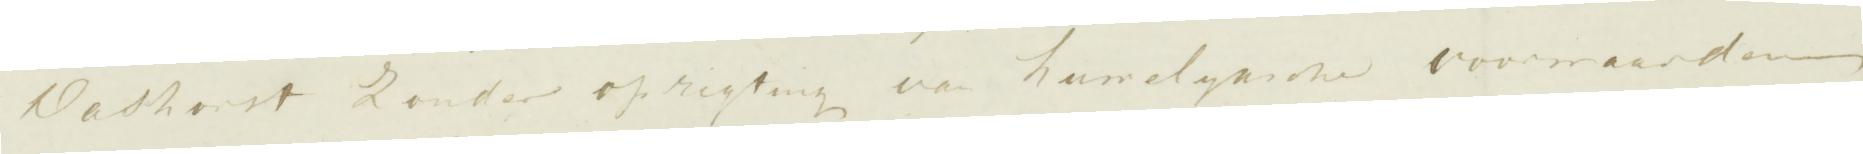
Dashorst zonder oprigting van Huwelyksche voorwaarden
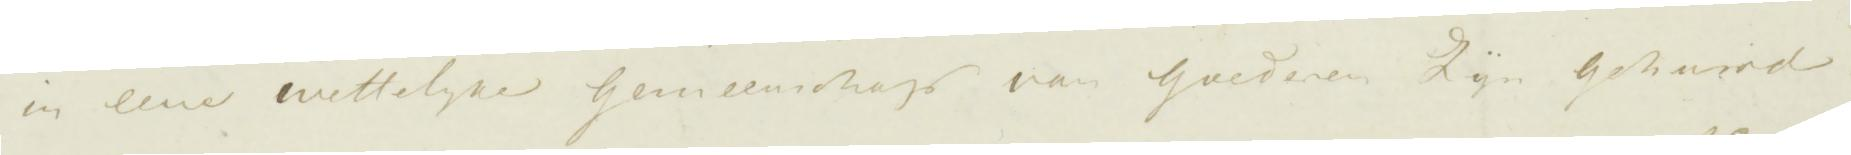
in eene wettelijke gemeenschap van goederen zijn gehuwd
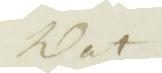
Dat
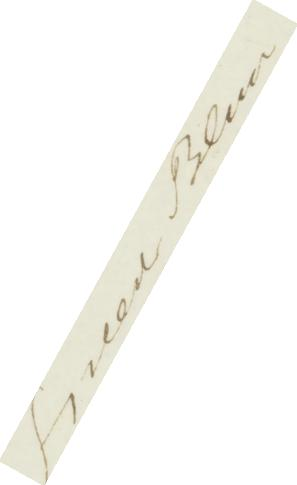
Tweede Blad
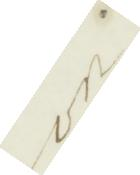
vn
